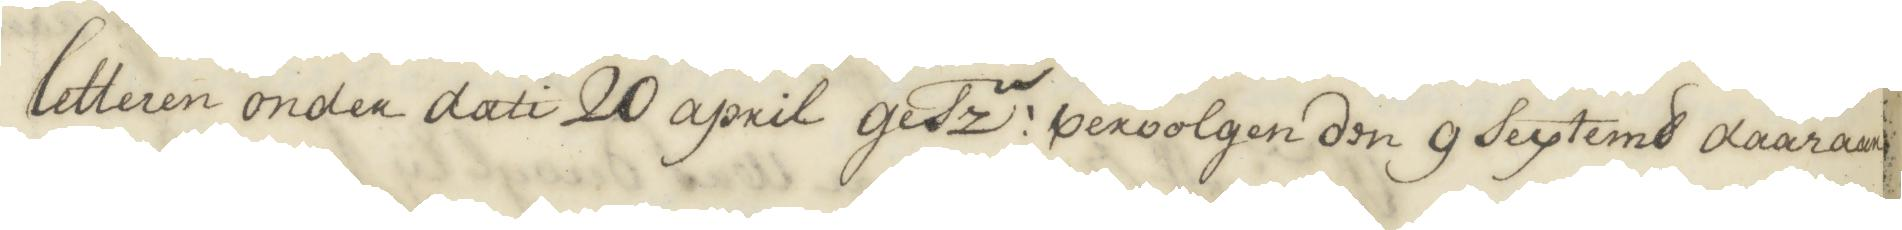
letteren onder dati 20 april gesz:n vervolgen den 9 Septemb daaraan
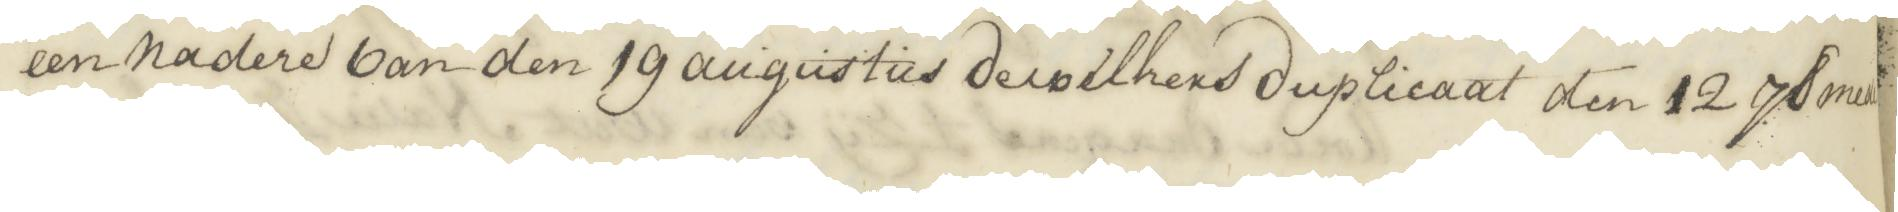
een nadere van den 19 augustus dewelkers duplicaat den 12 7b med
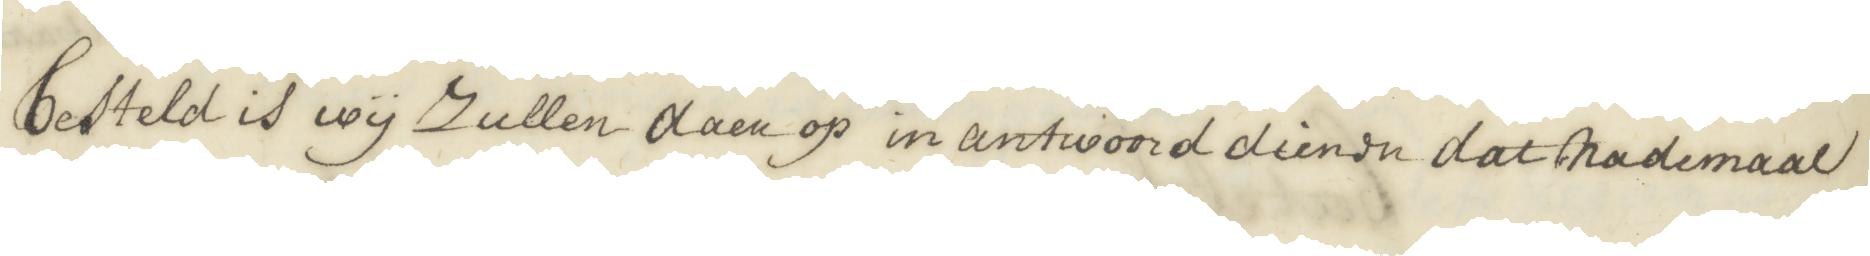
besteld is wij zullen daer op in antwoord dienen dat nademaal
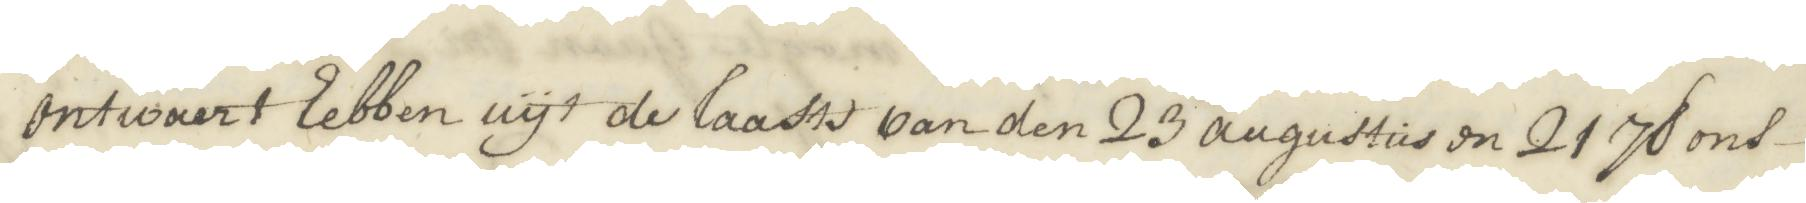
ontwaert hebben uijt de laaste van den 23 augustus en 21 7b ons—
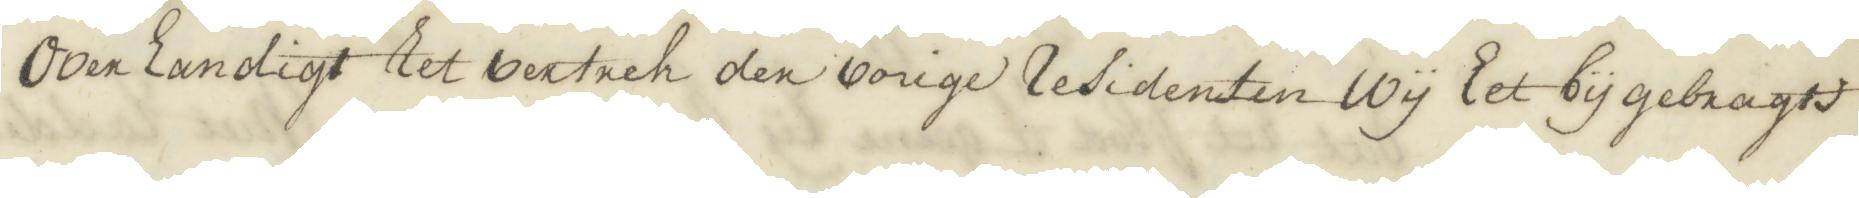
over handigt het vertrek der vorige residenten wij het bij gebragte
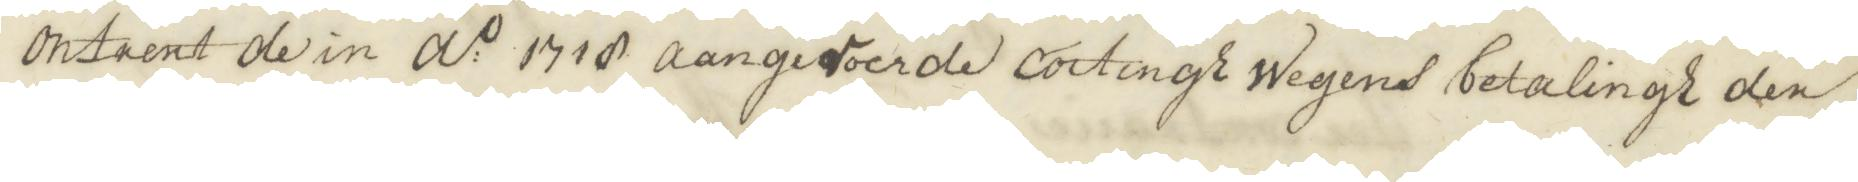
ontrent de in a:o 1718 aangevoerde cortingh wegens betalingh der
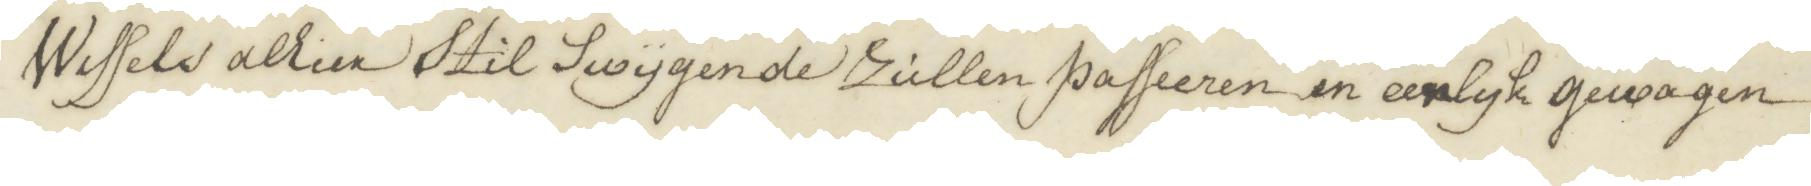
wissels alhier stil swijgende zullen passeeren en eerlyk gewagen
